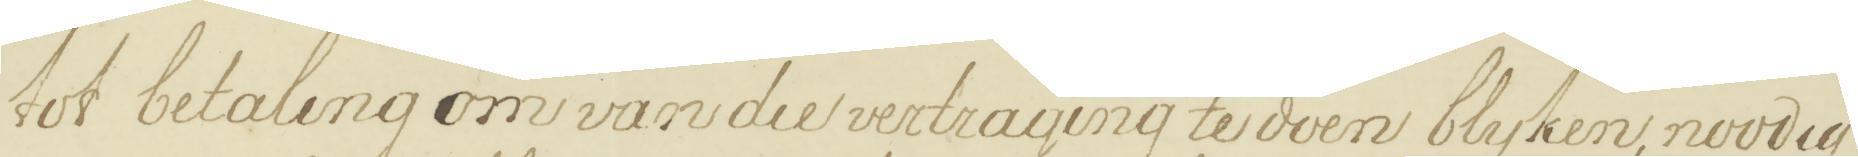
tot betaling om van die vertraging te doen blyken, noodig
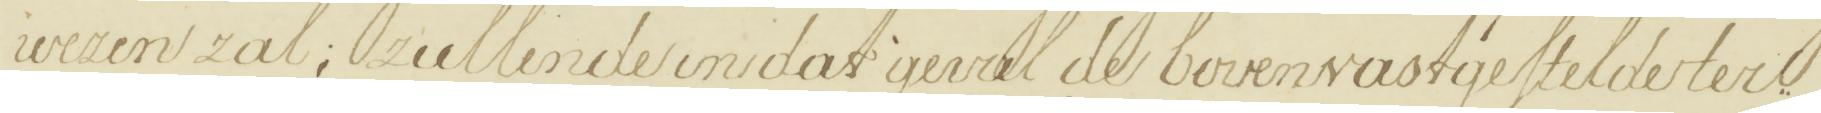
wezen zal; zullende in dat geval de, boven vastgestelde ter„
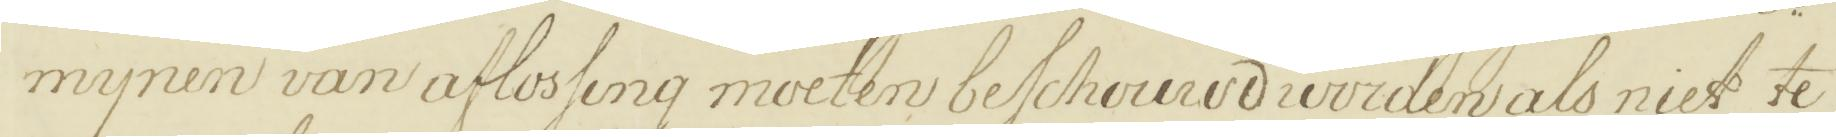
mynen van aflossing moeten beschouwd worden als niet te
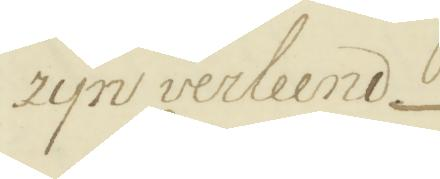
zyn verleend.
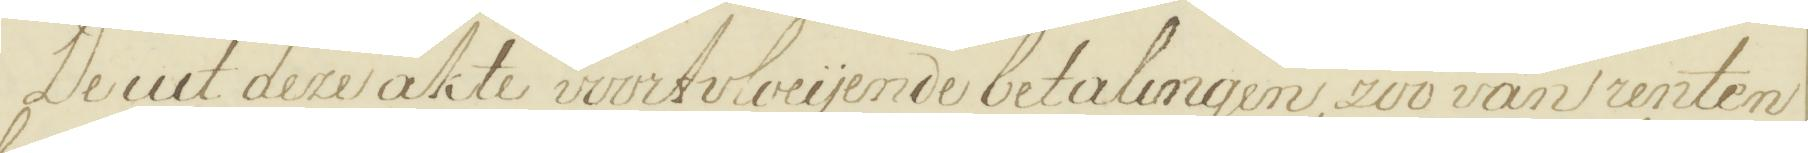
De uit deze akte voortvloeijende betalingen, zoo van renten
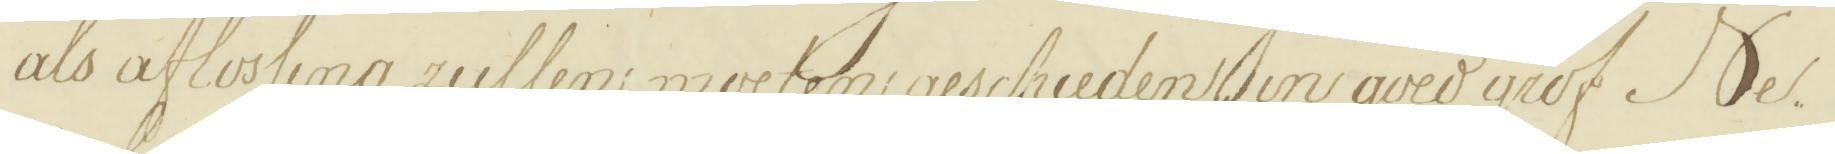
als aflossing, zullen moeten geschieden in goed grof Ne„
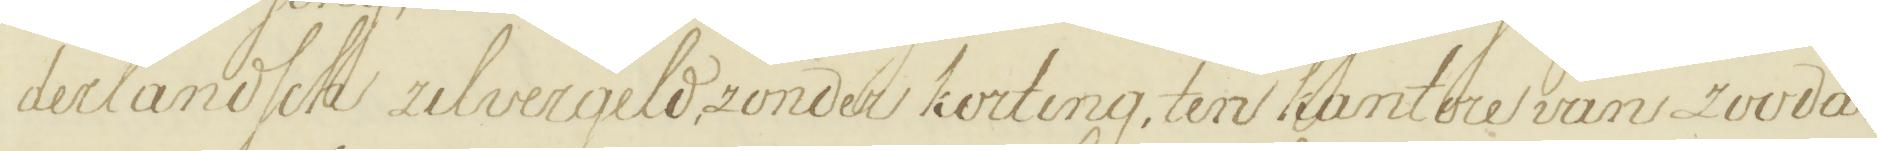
derlandsch zilvergeld, zonder korting, ten kantore van zooda
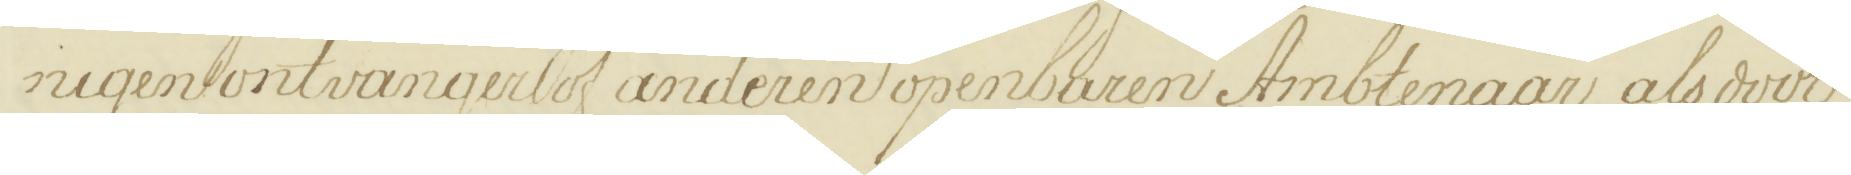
nigen ontvanger of anderen openbaren Ambtenaar, als door
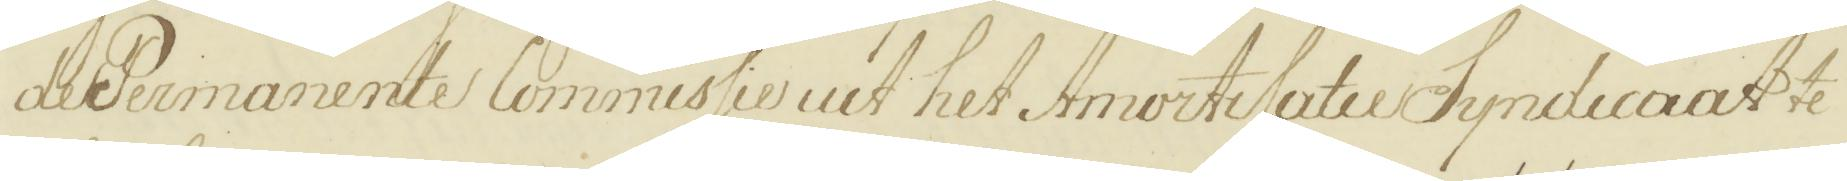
de Permanente Commissie uit het Amortisatie Syndicaat te
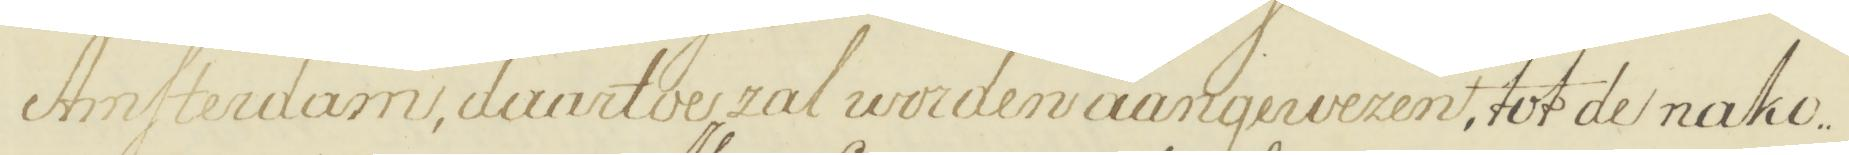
Amsterdam, daartoe zal worden aangewezen, tot de nako„
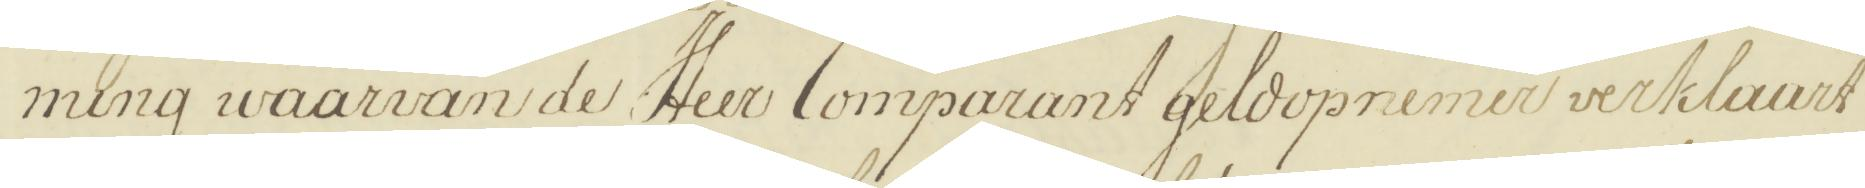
ming waarvan de Heer Comparant geldopnemer verklaart
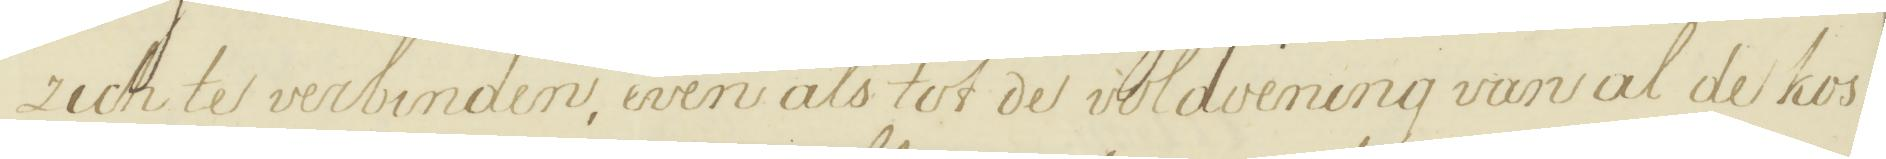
zich te verbinden, even als tot de voldoening van al de kos
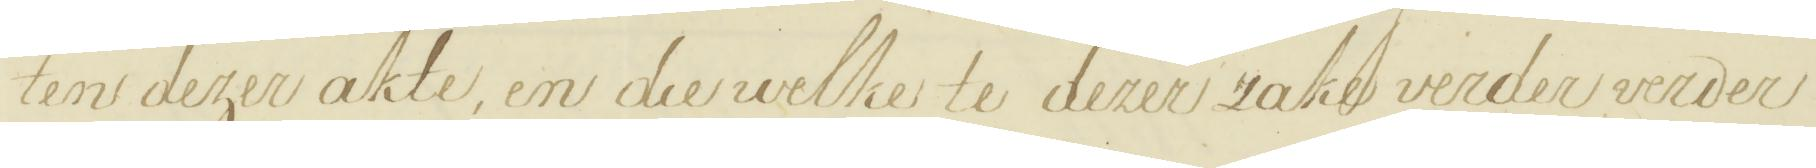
teni dezer akte, en die welke te dezer zake verder verder
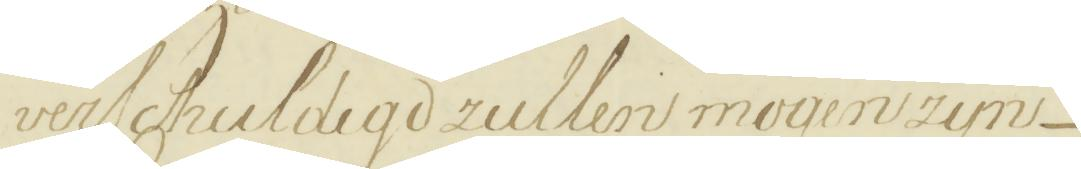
verschuldigd zullen mogen zyn
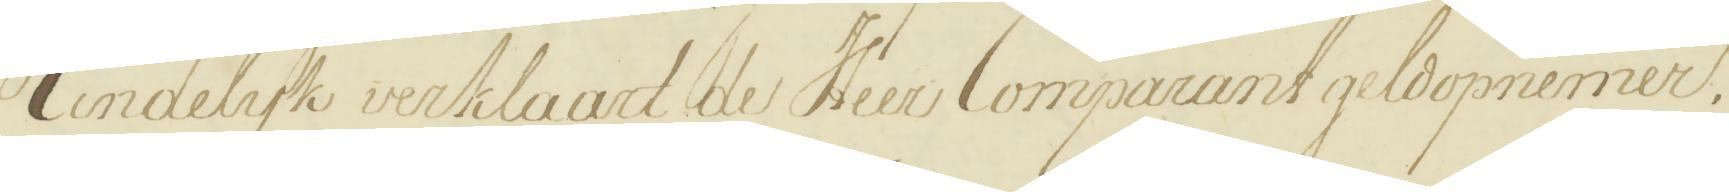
Eindelyk verklaart de Heer Comparant geldopnemer,
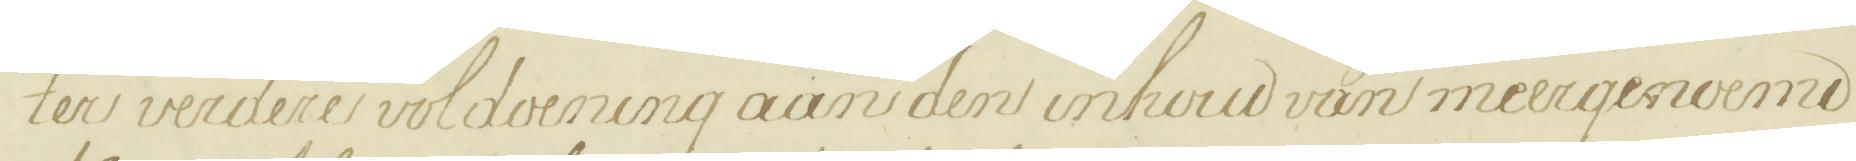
ter verdere voldoening aan den inhoud van meergenoemd
